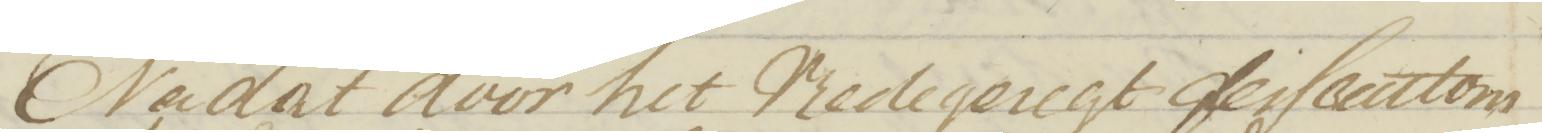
Nadat door het Vredegeregt des Cantons
